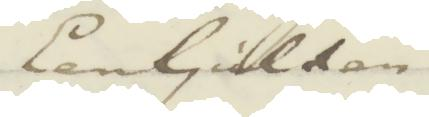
EenGulden
